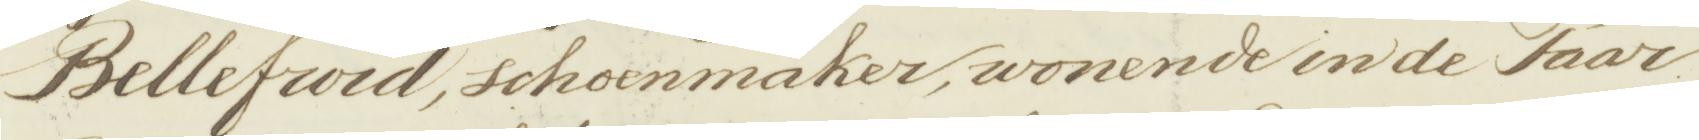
Bellefroid, schoenmaker, wonende in de Paar.
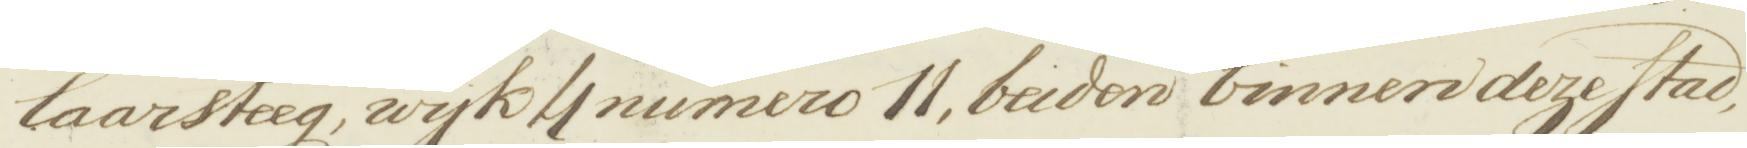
laarsteeg, wijk 4 numero 11, beiden binnen deze stad,
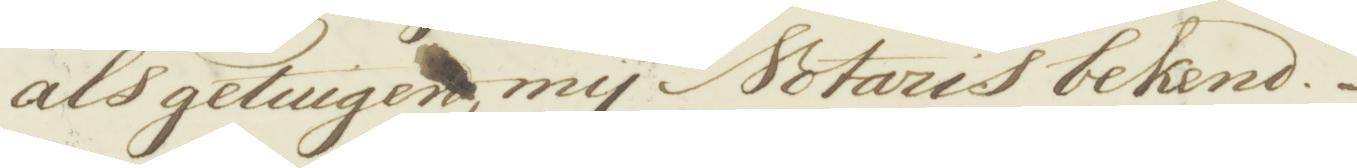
als getuigen, mij Notaris bekend. -
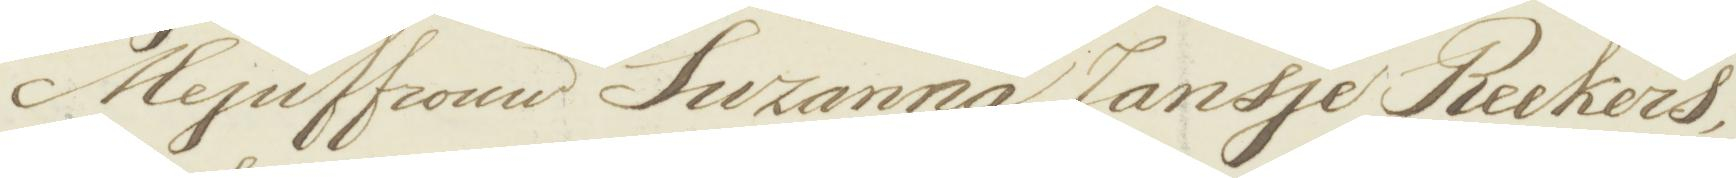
Mejuffrouw Suzanna Jansje Reekers,
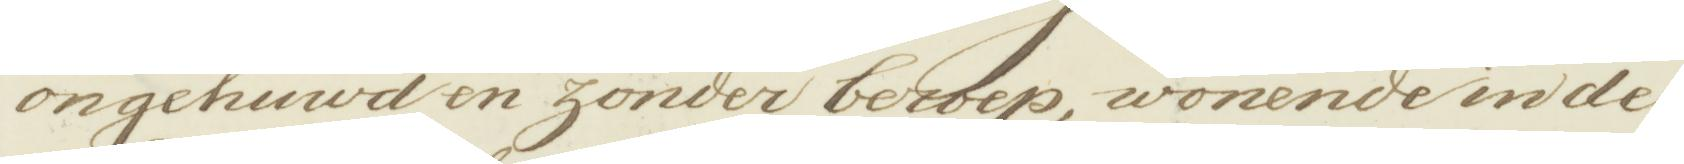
ongehuwd en zonder beroep, wonende in de
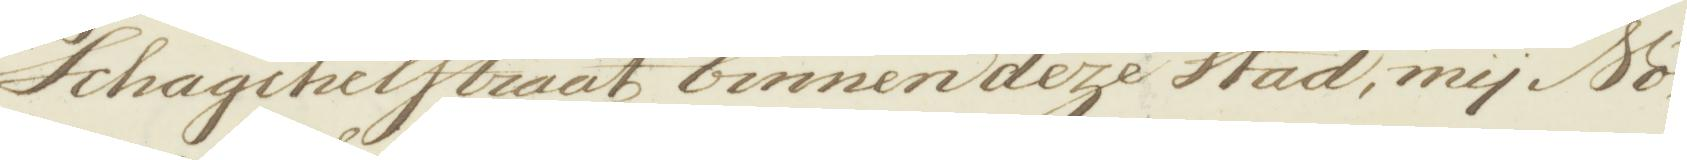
Schagchelstraat binnen deze stad, mij No,
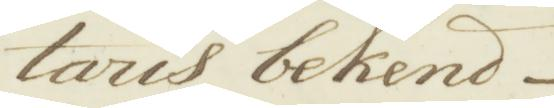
taris bekend -
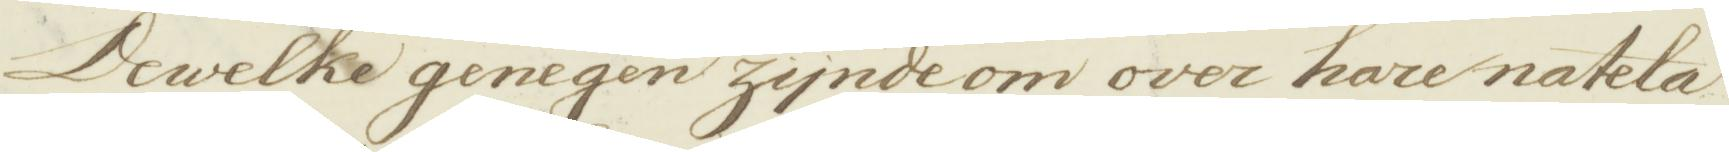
Dewelke genegen zijnde om over hare natela
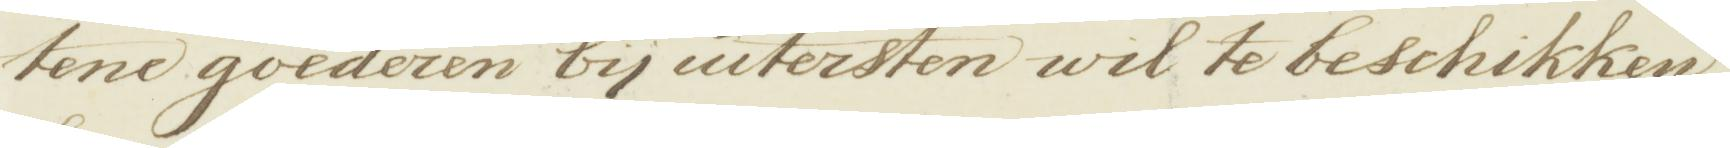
tene goederen bij uitersten wil te beschikken
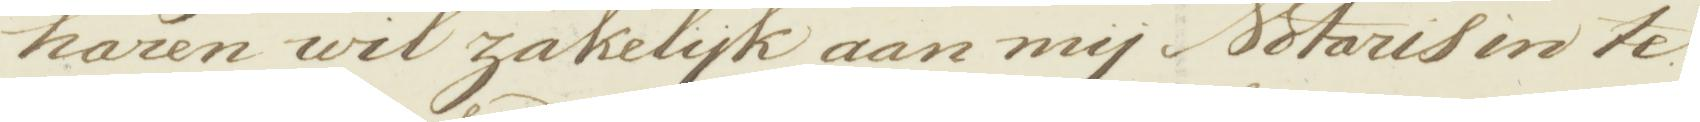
haren wil zakelijk aan mij Notaris in te.
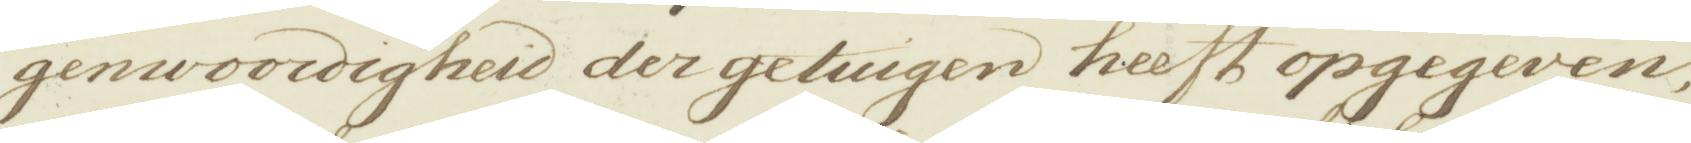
genwoordigheid der getuigen heeft opgegeven,
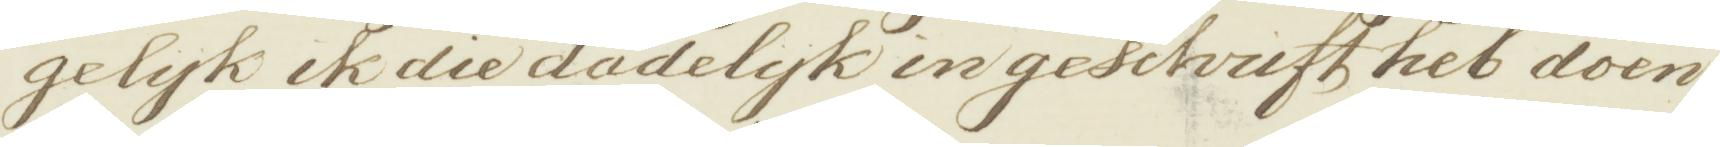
gelijk ik die dadelijk in geschrift heb doen
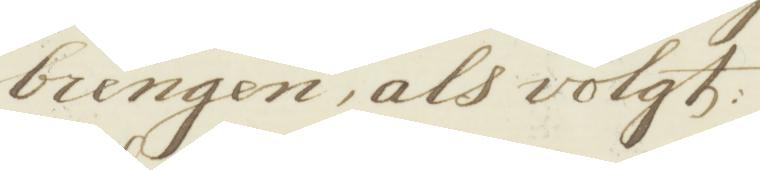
brengen, als volgt:
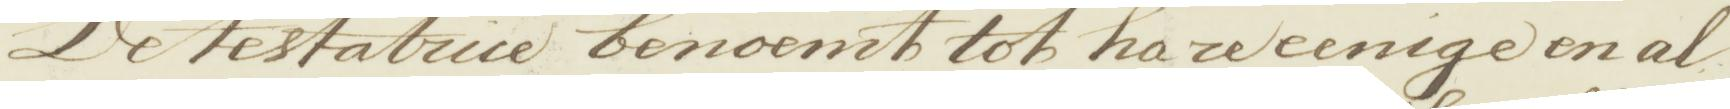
De Testatrice benoemt tot hare eenige en al„
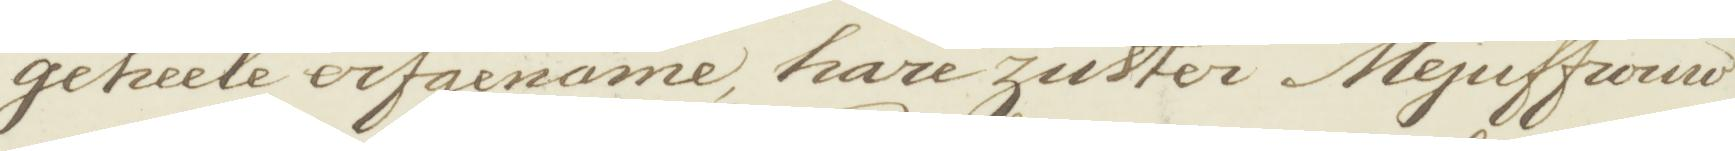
geheele erfgename, hare zuster Mejuffrouw
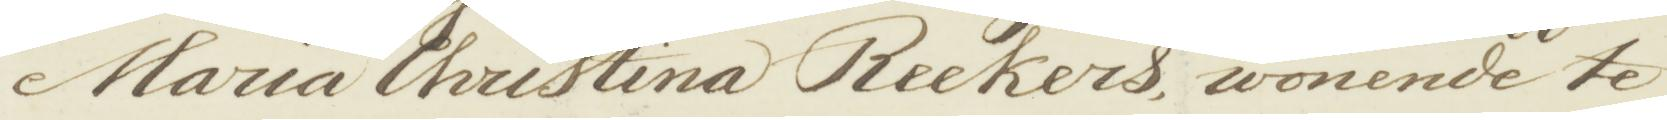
Maria Christina Reekers, wonende te
